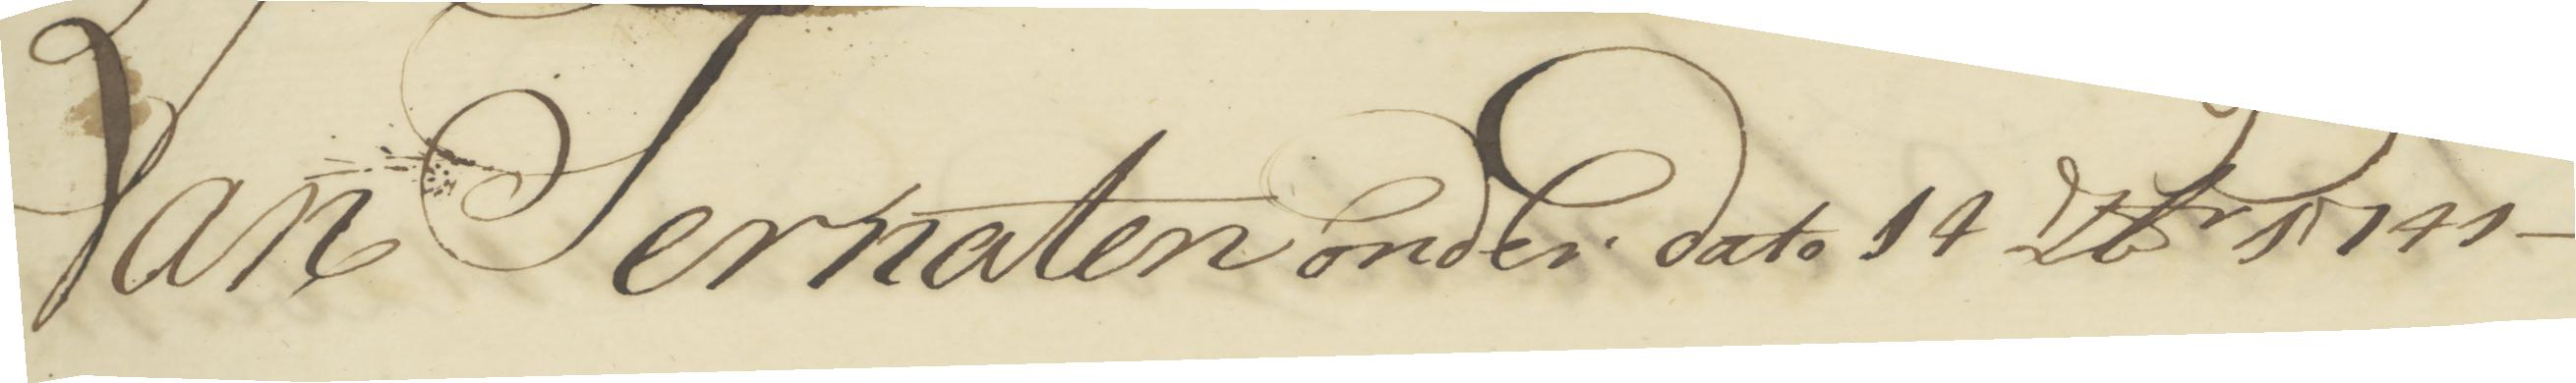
Van Ternaten onder dato 14 7br 1741—
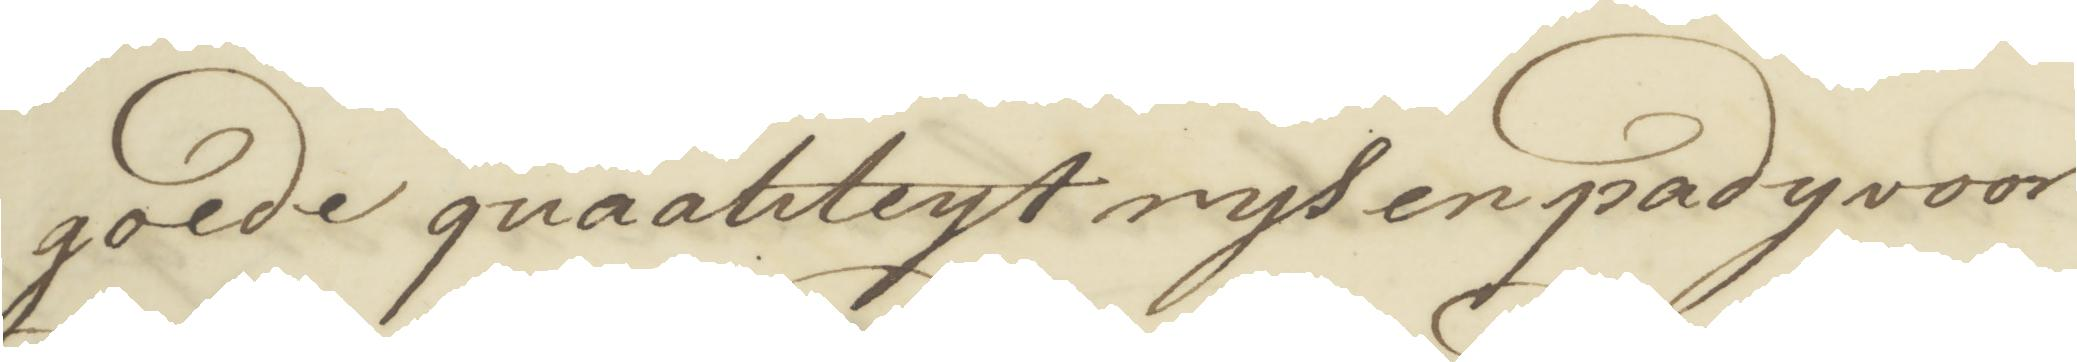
goede quaaliteyt rys en pady voor
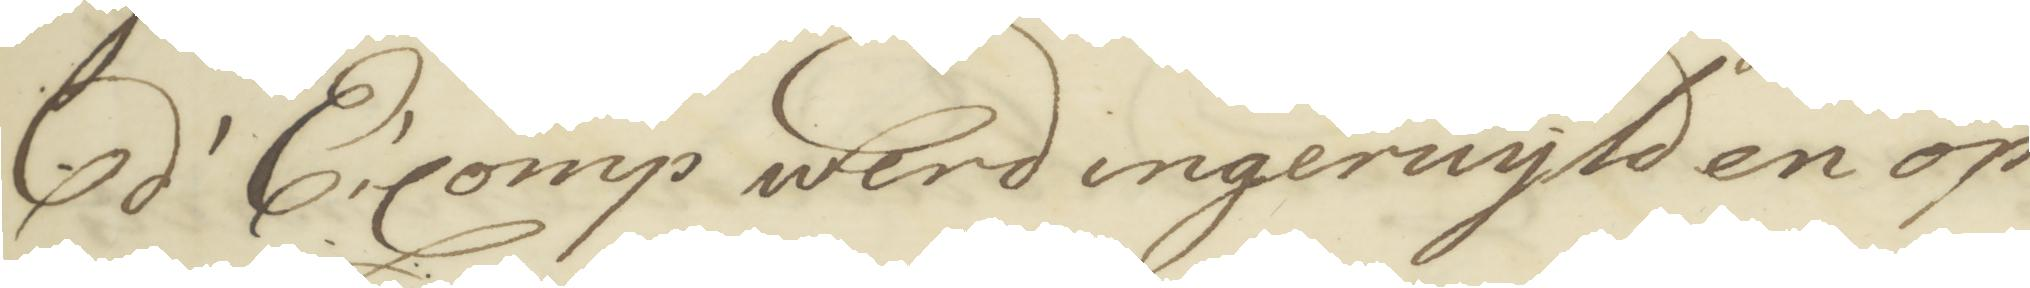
d’ E:Comp werd ingeruijld en op
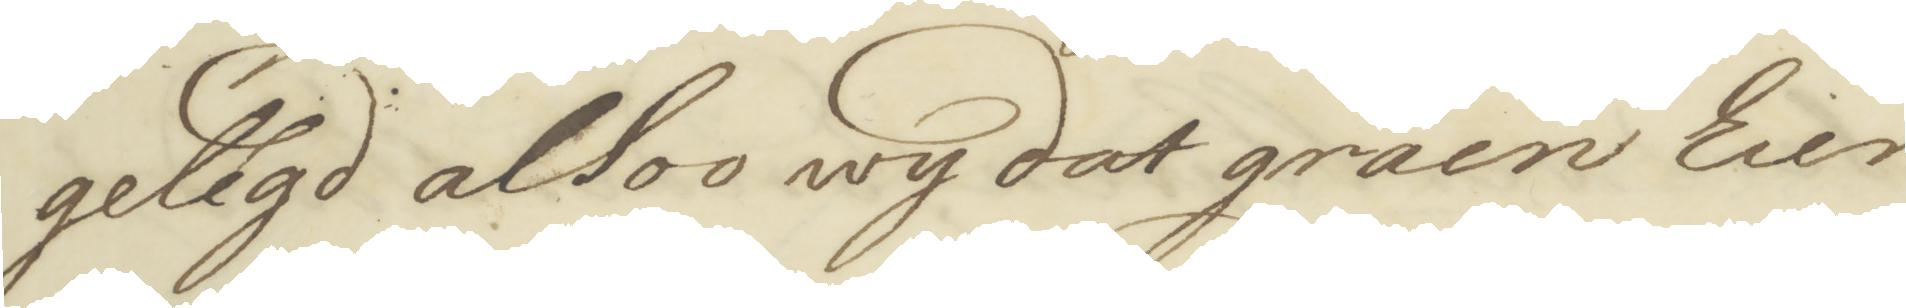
gelegd alsoo wy dat graen hier
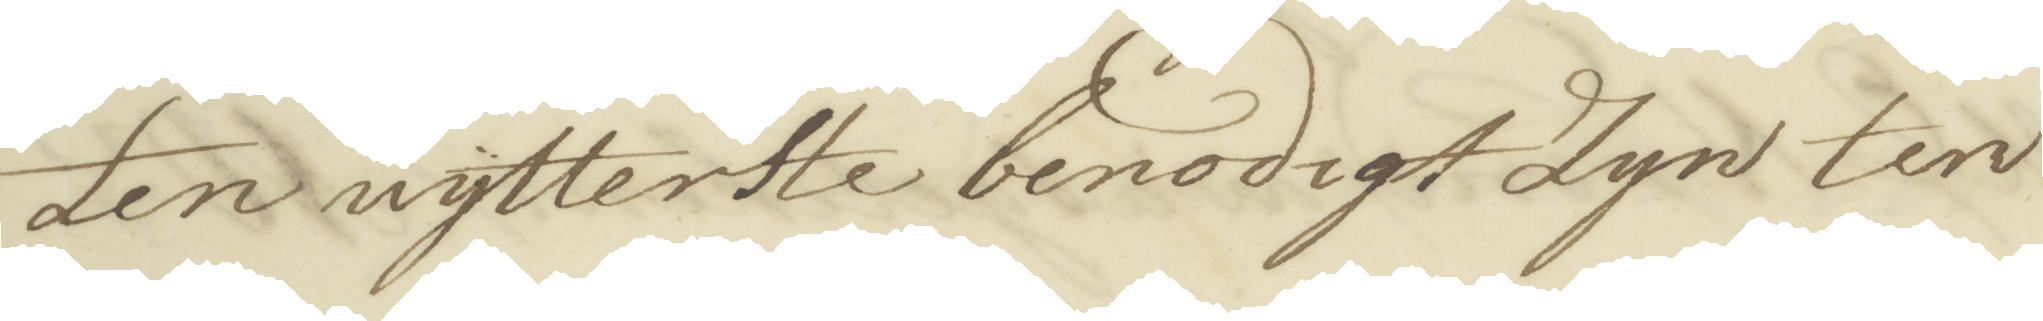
ten uijtterste benodigt zyn ten
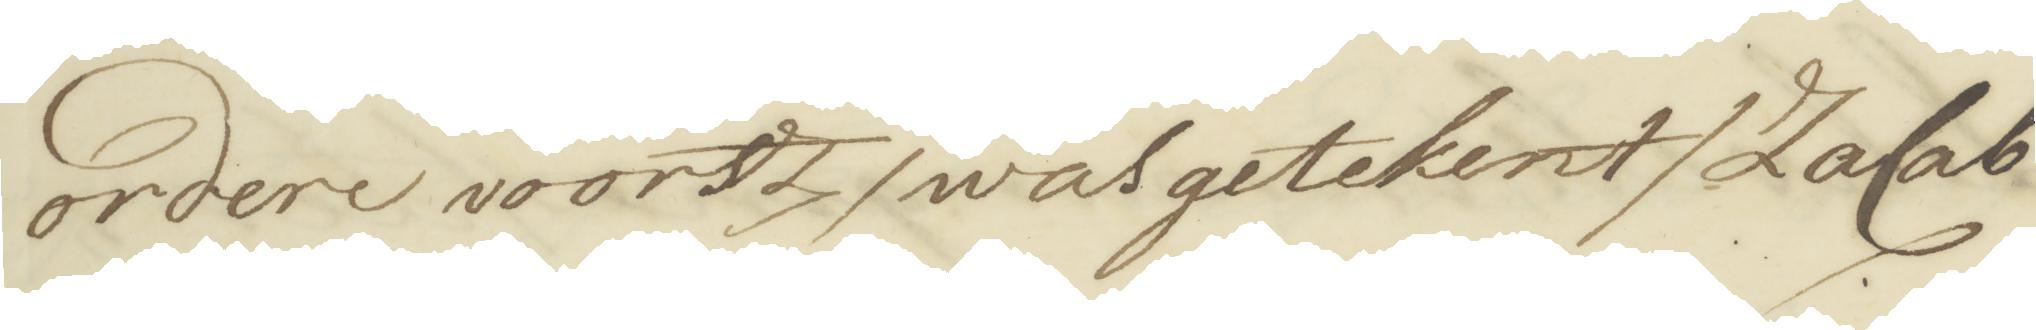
ordere voorsz / was getekent / Iacob
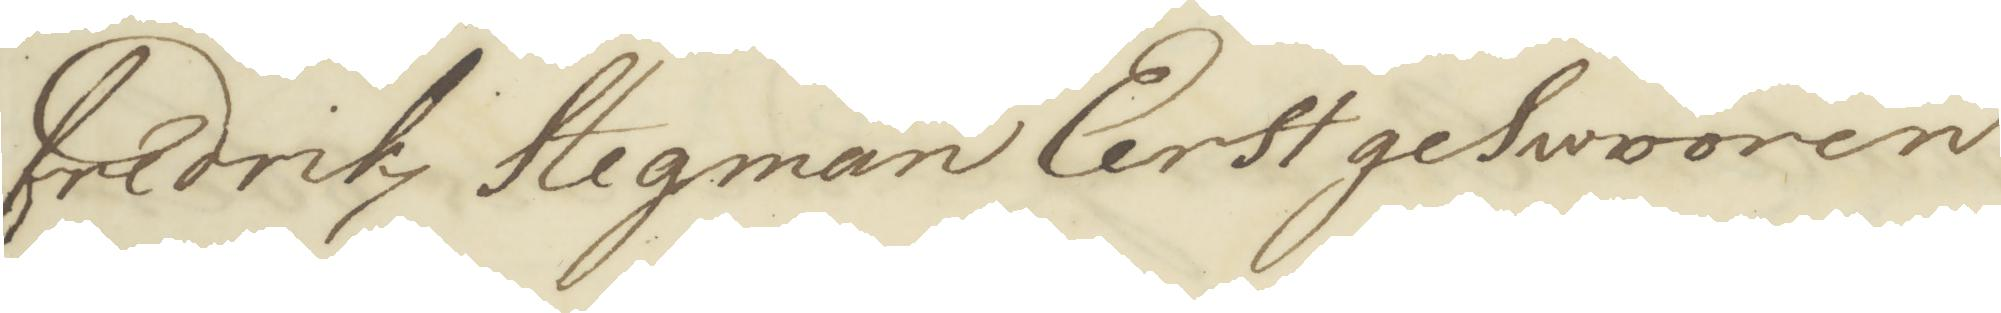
fredrik stegman Eerst geswooren
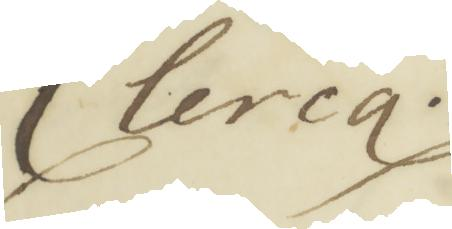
Clercq.
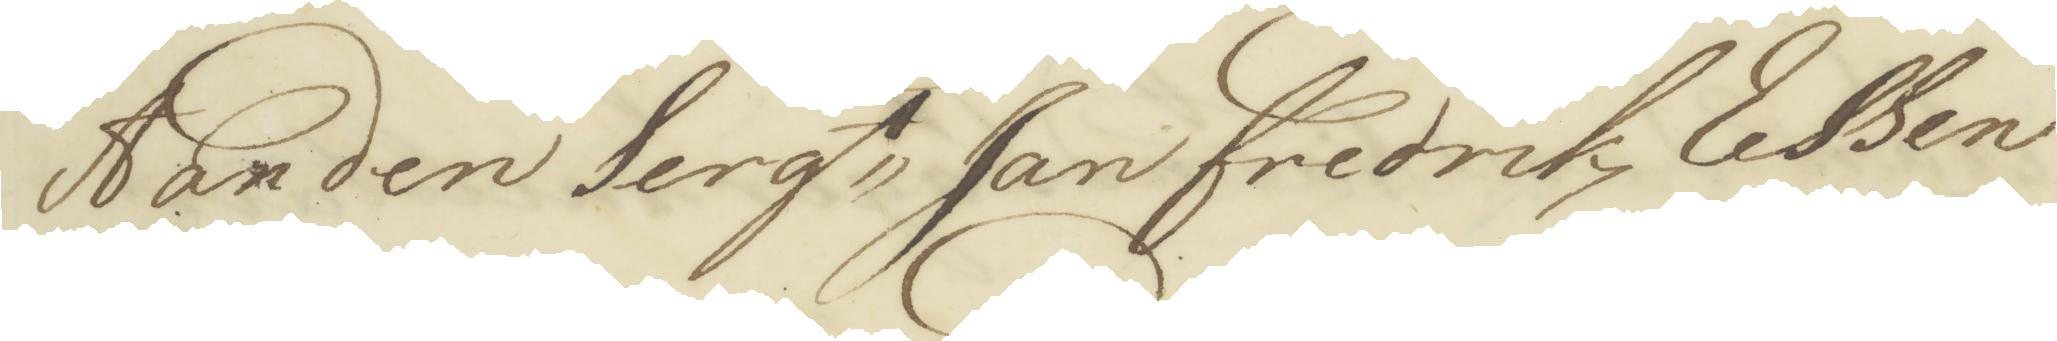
Aan den serg„t Jan fredrik hessen
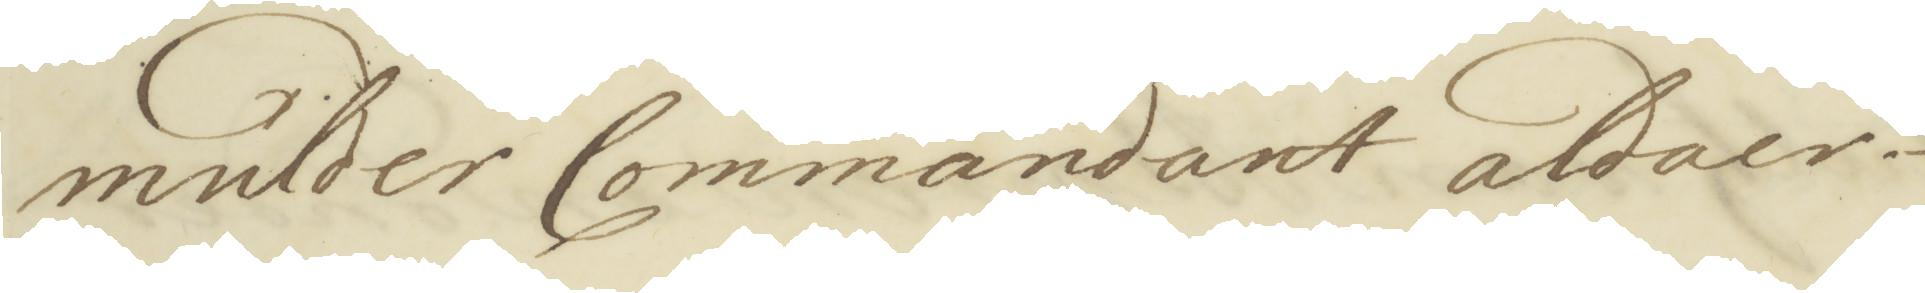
mulder Commandant aldaer.
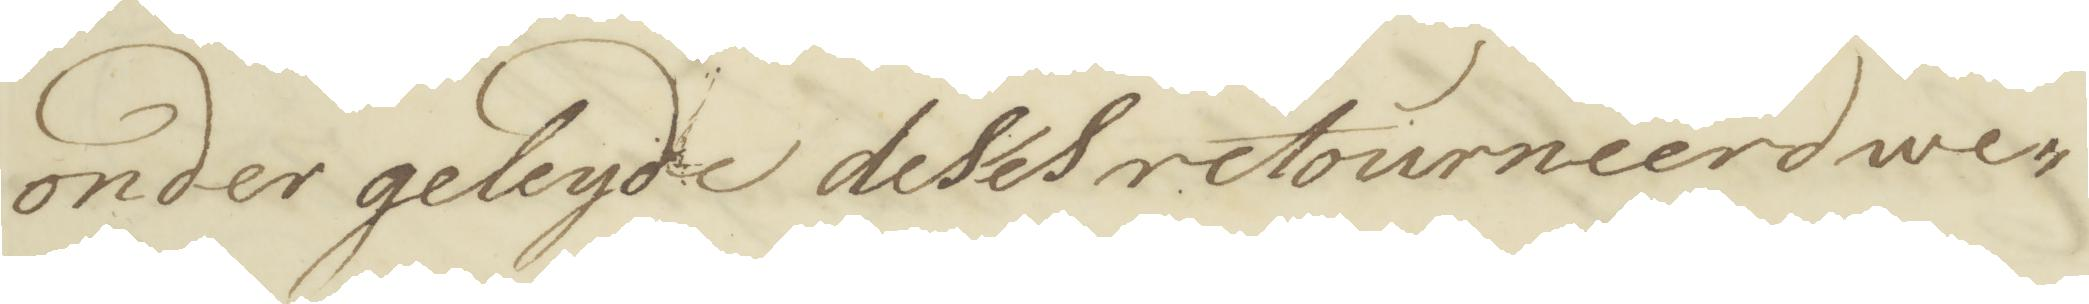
onder geleijde deses retourneerd we
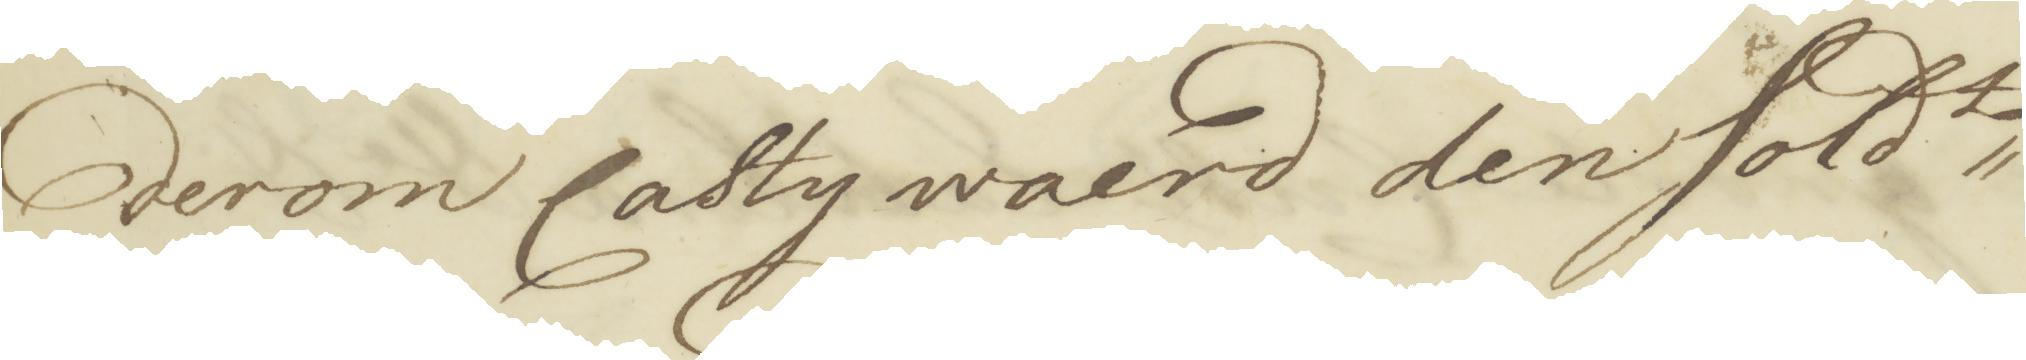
derom Casty waerd den sold„t
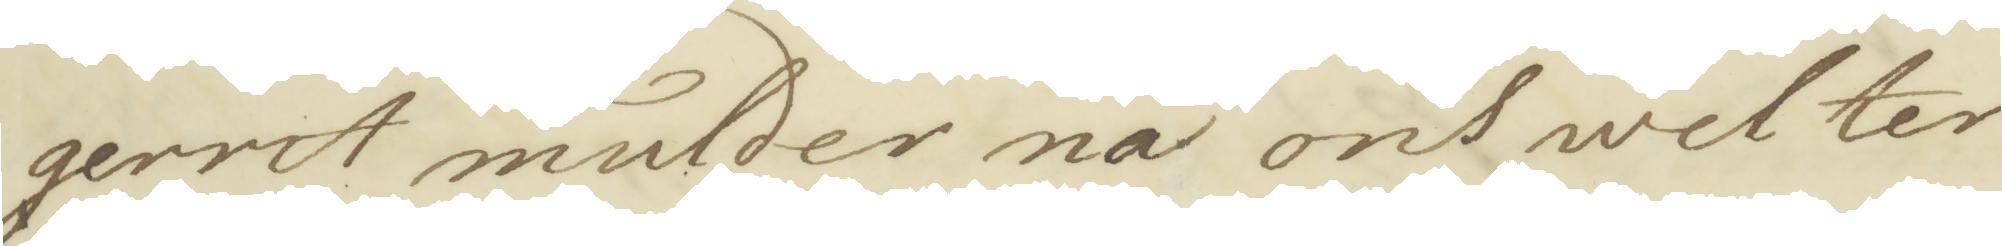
gerrit mulder na ons wel ter
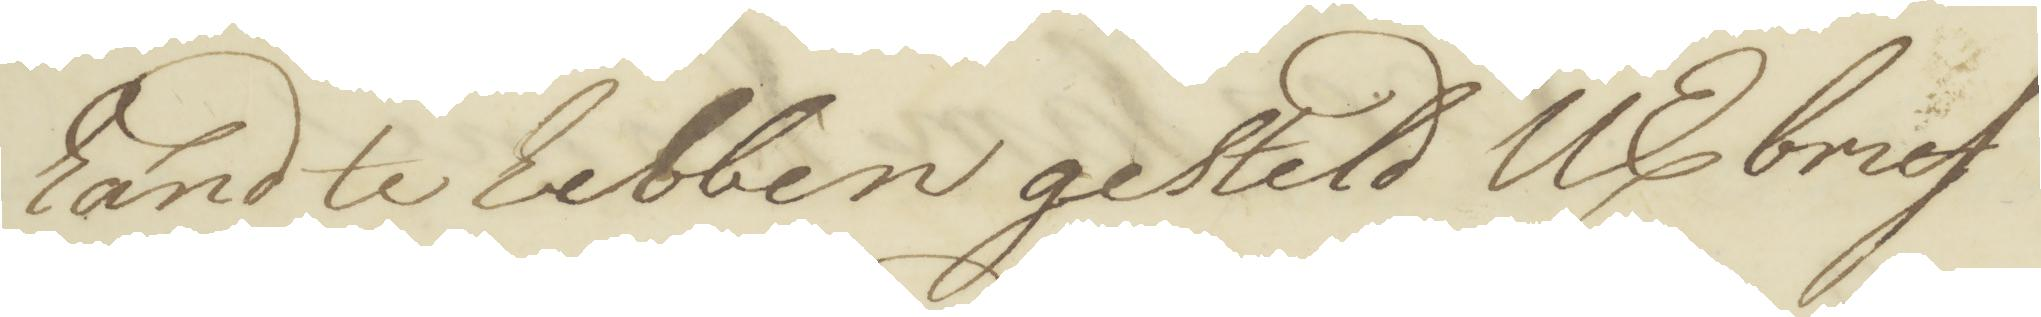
hand te hebben gesteld UE brief
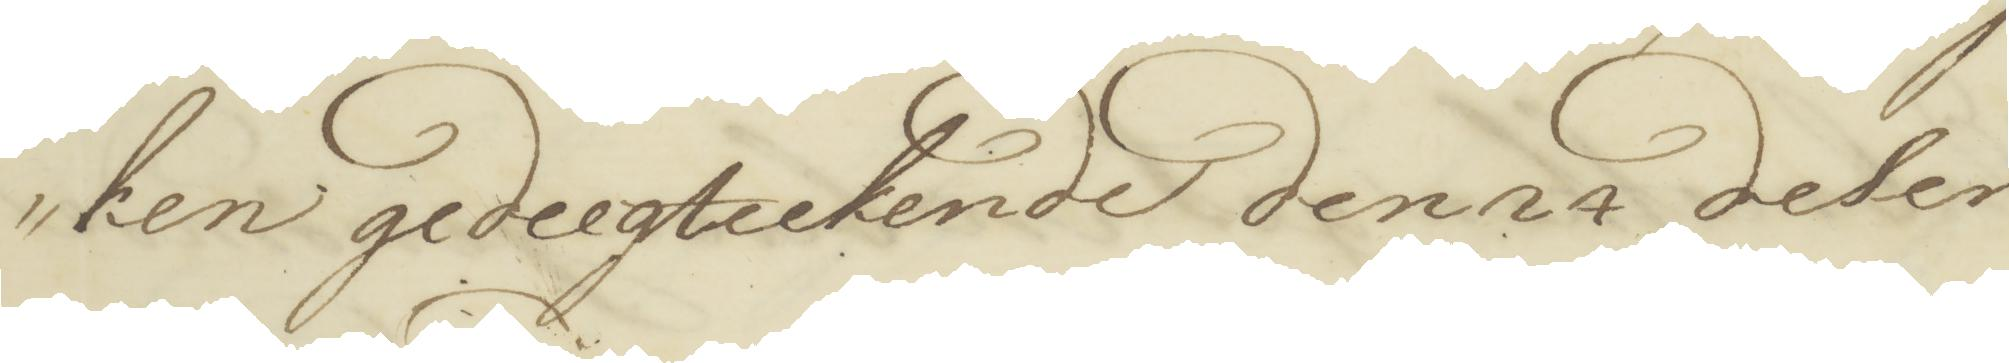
„ken gedagteekende den 24 deser
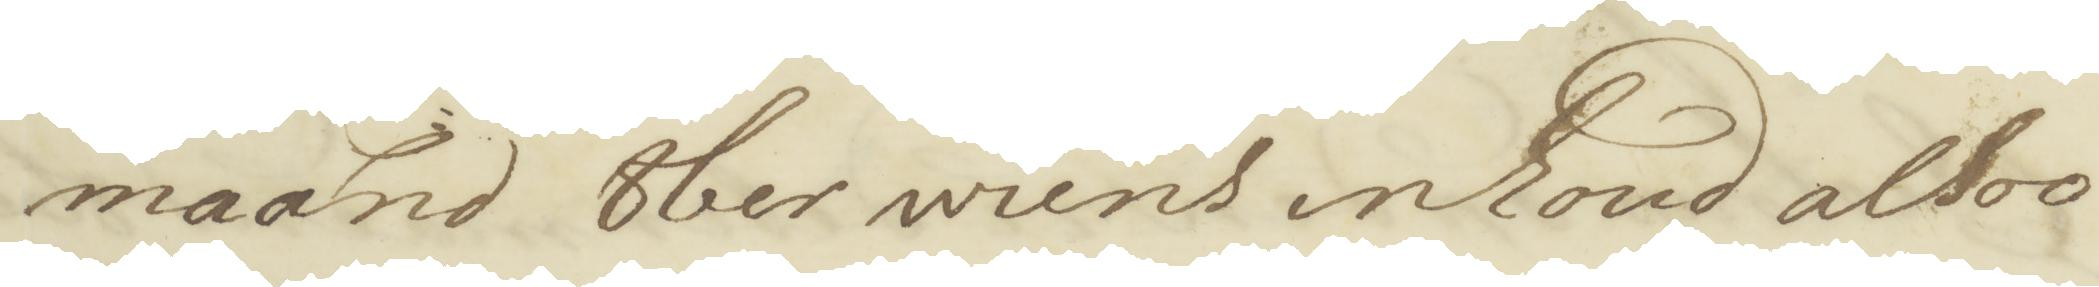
maand 8ber wiens inhoud alsoo
